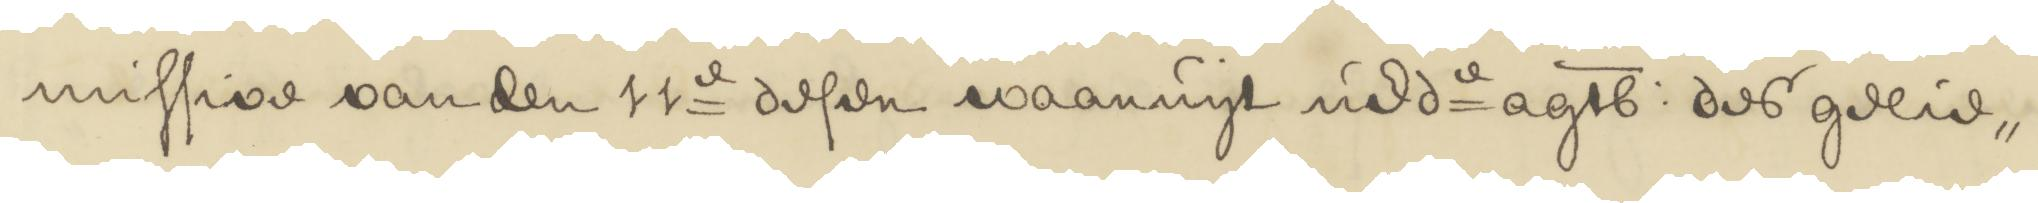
missive van den 11=e deser waaruijt uEd=e agtb: des gelie„
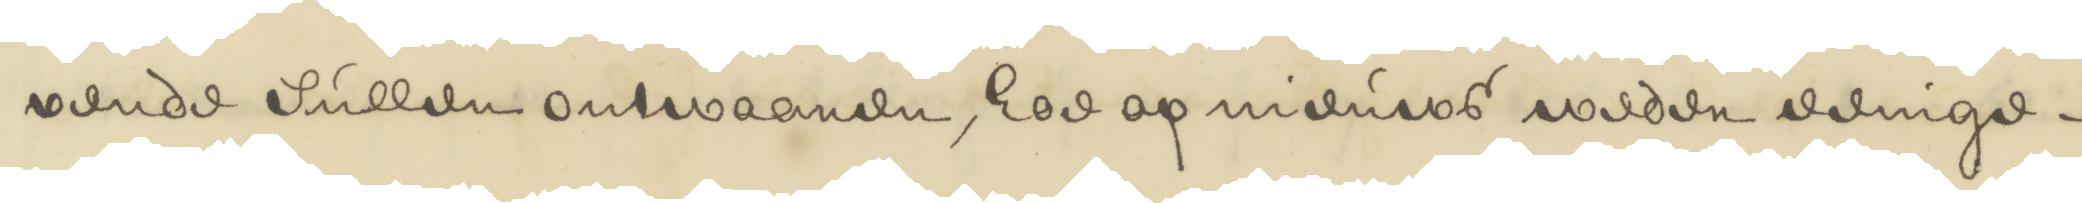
vende sullen ontwaaren, hoe op nieuws weder eenige —
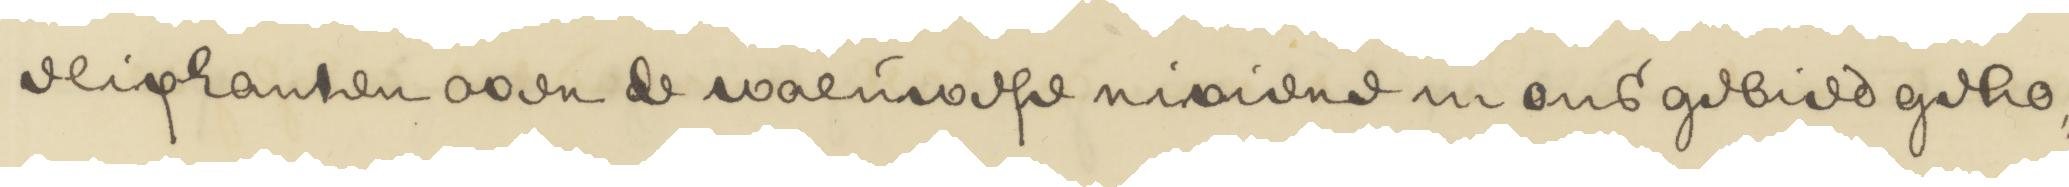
eliphanten over de waluwese riviere in ons gebied geko„
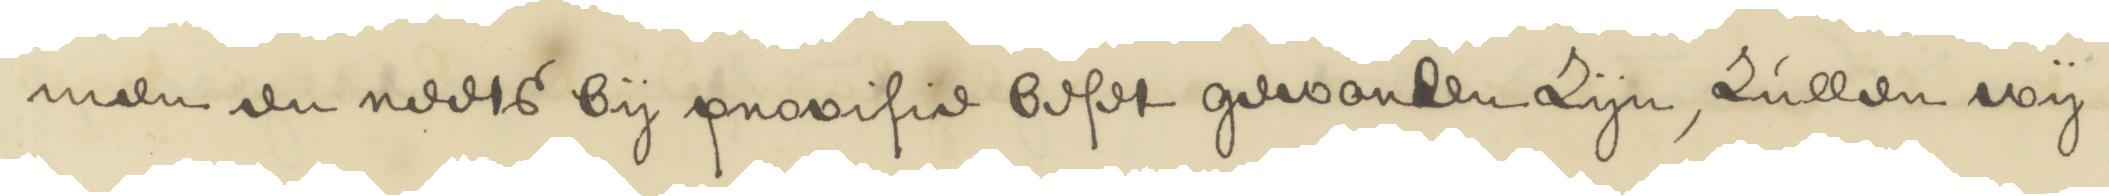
men en reets bij provisie beset geworden zijn, zullen wij
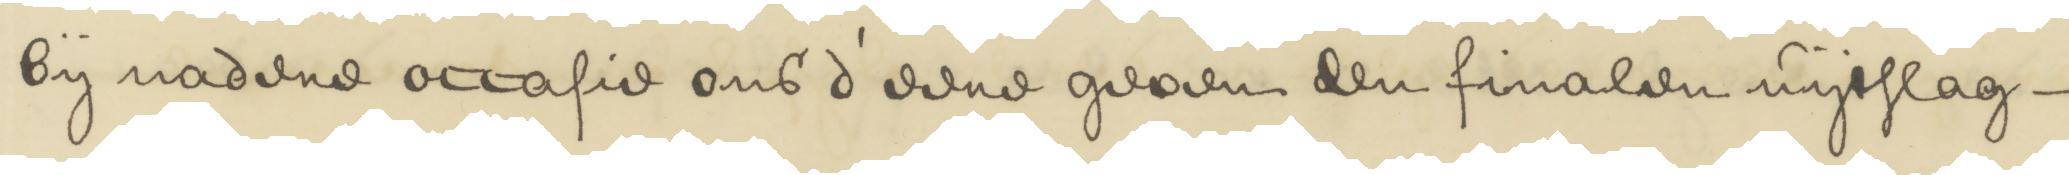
bij nadere occasie ons d’eere geven den finalen uijtslag —
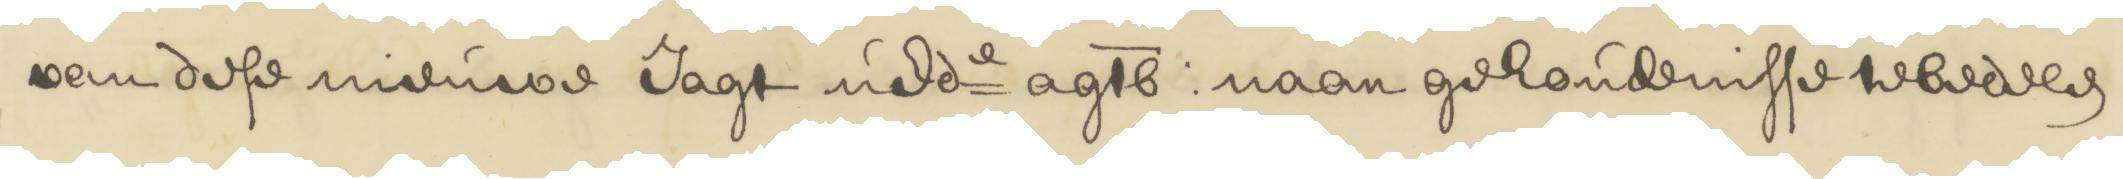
van dese nieuwe Iagt uEd=e agtb: naar gehoudenisse te bedelen
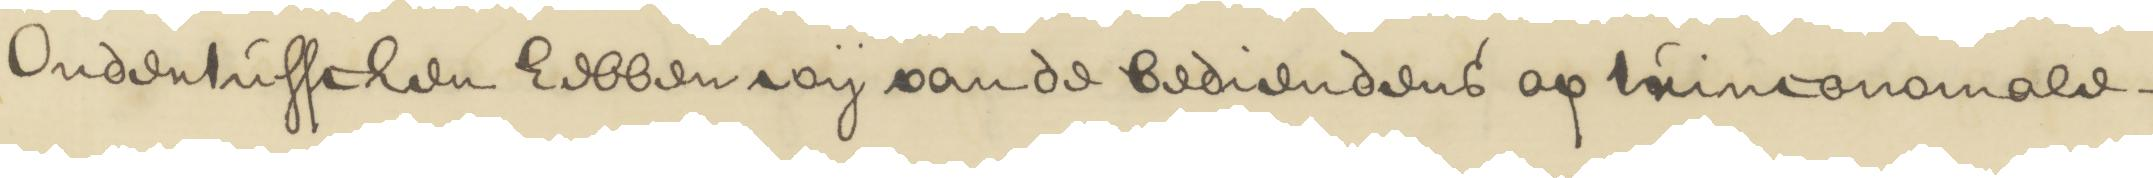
Ondertusschen hebben wij van de bediendens op tuinconomale
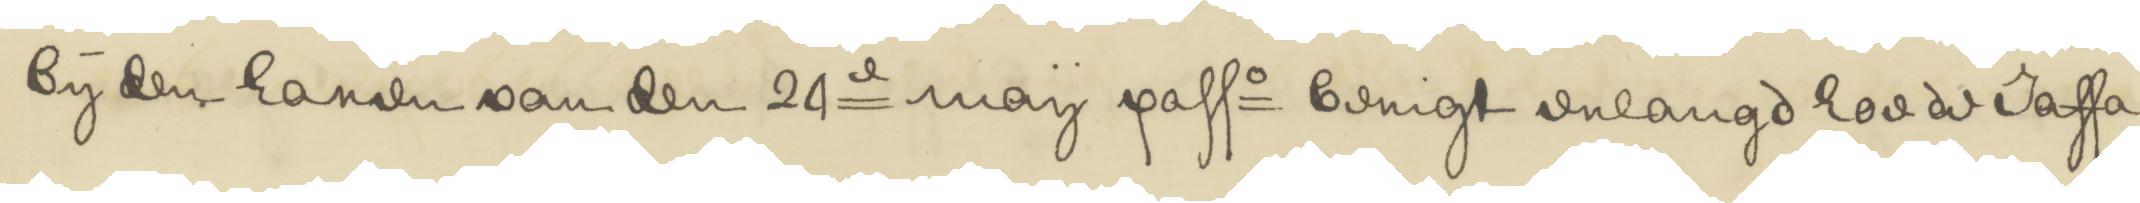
bij den haren van den 24=e maij pass=o berigt erlangd hoe de Iaffa
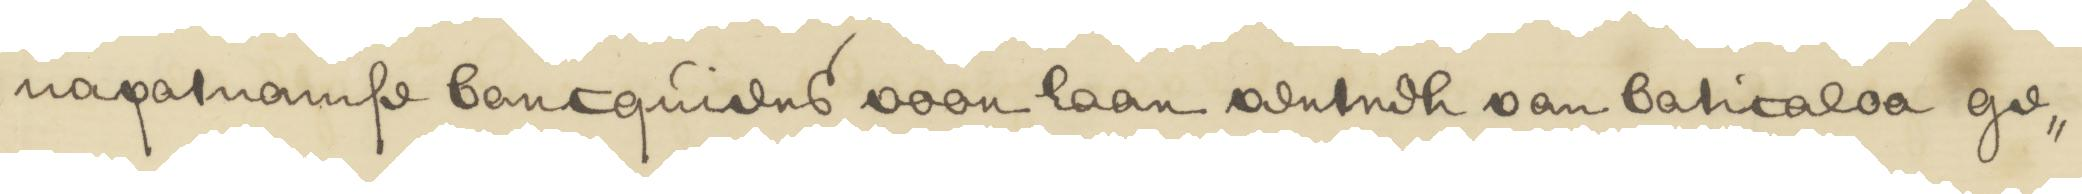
napatnamse bancquiers voor haar vertrek van baticaloa ge„
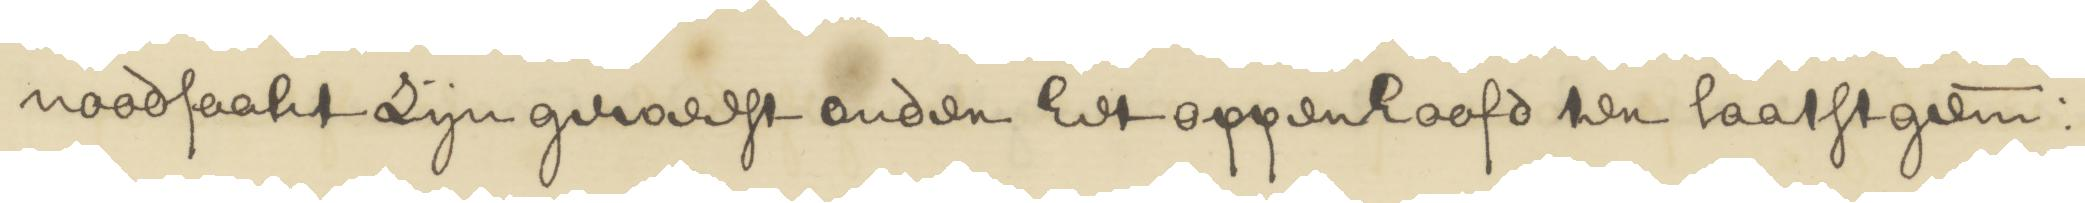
noodsaakt zijn geweest onder het opperhoofd ter laatst gem:
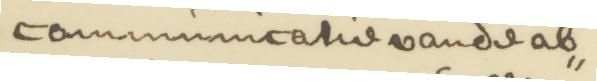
communicatie van de ab„
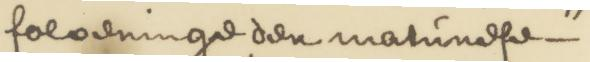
solveringe der maturese
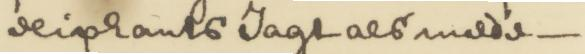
eliphants Iagt als mede
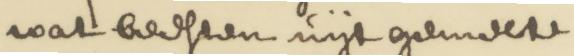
wat beesten uijt gemelte
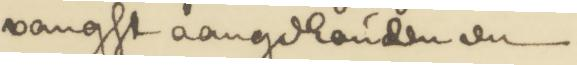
vangst aangehouden en
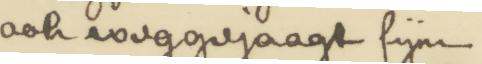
ook weggejaagt sijn
